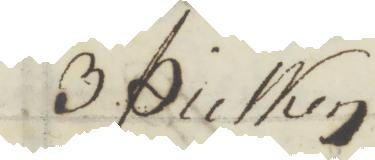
3 Piekken
